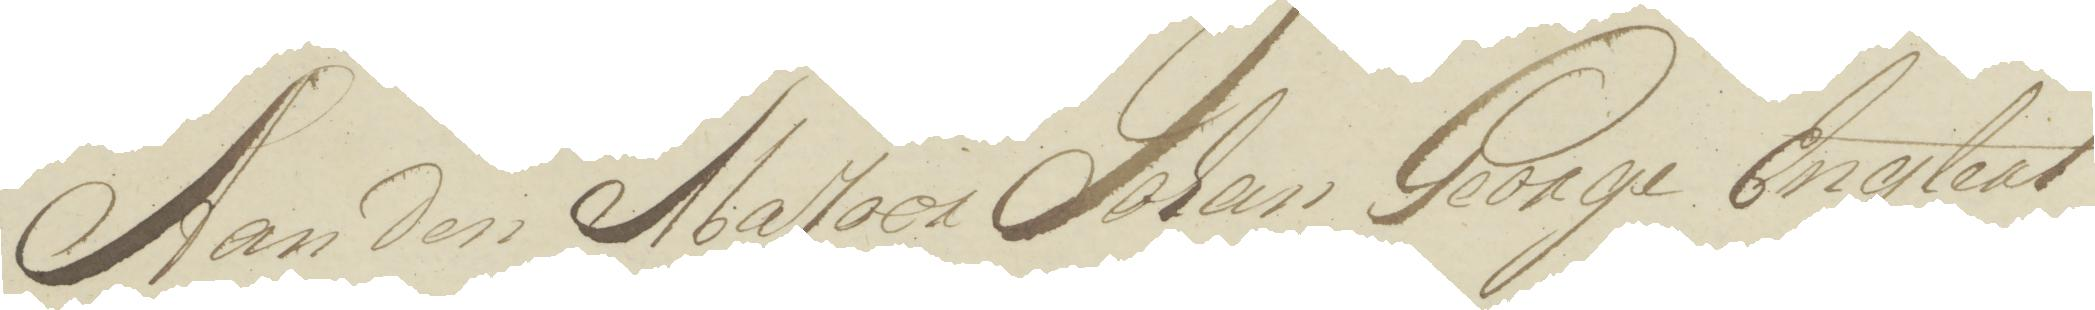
Aan den Majoor Johan George Englert
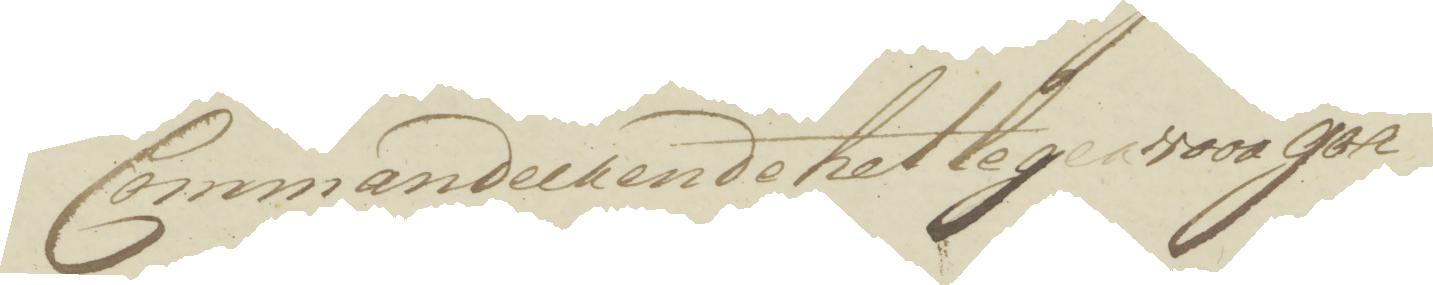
Commandeerende het leger voor goa
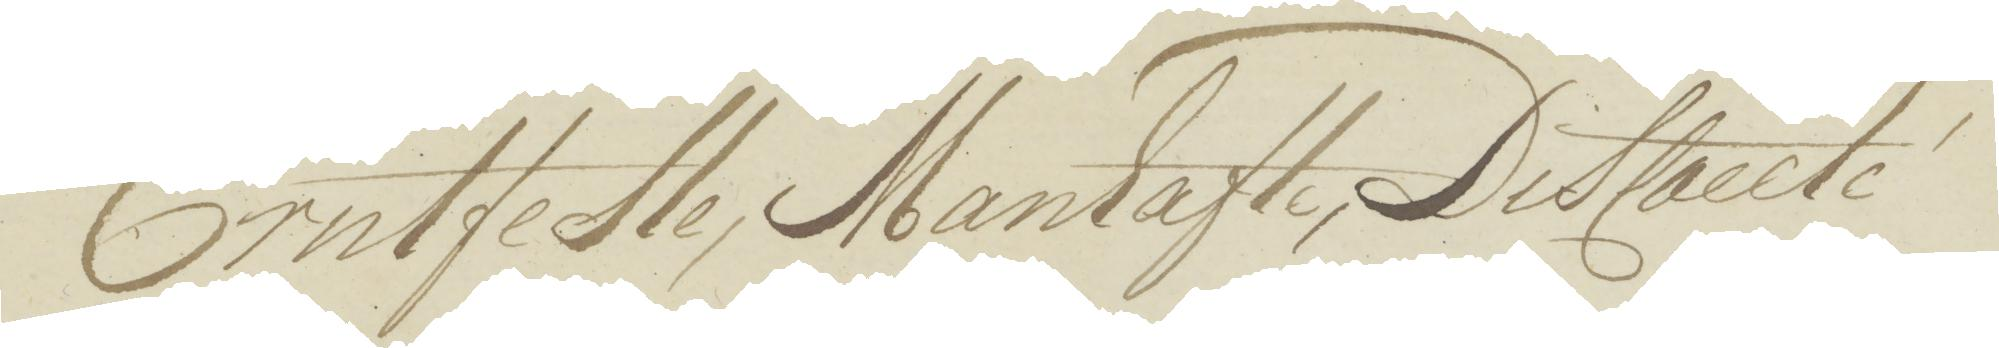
Erntfeste, Manhafte, Discreete
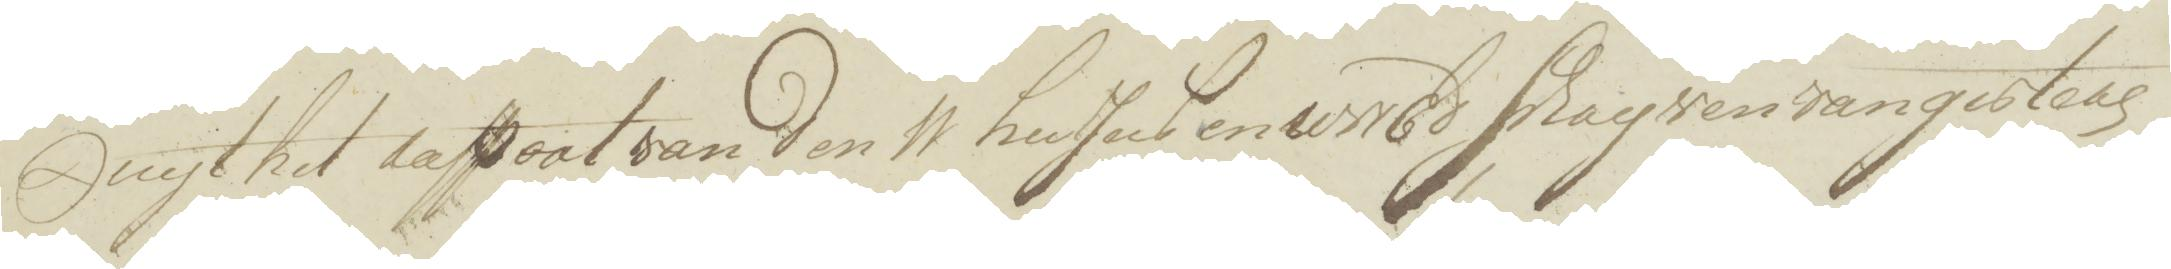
Ouijt het rapport van den 11 hujus uwEd schryven van gisteren
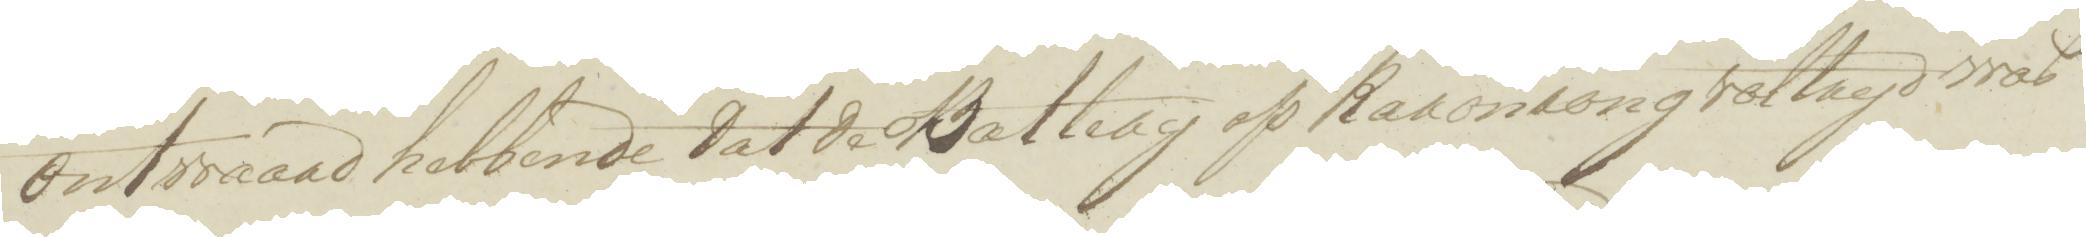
ontwaard hebbende dat de Batterij op karonrong voltryd was
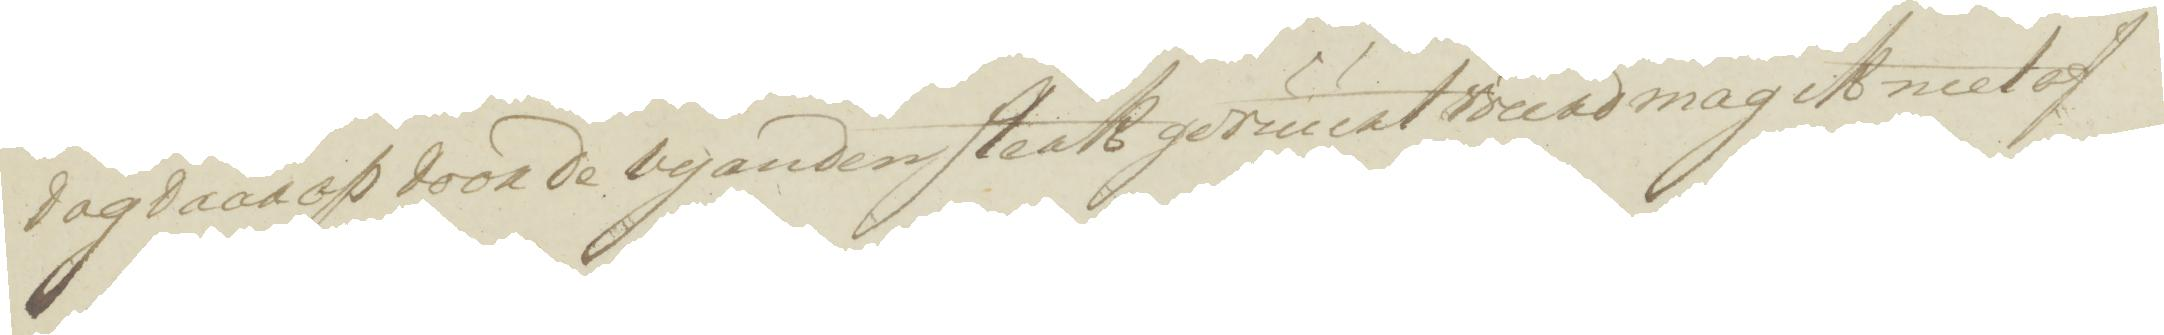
dog daar op door de vijanden sterk gevuurt weerd mag ik met of
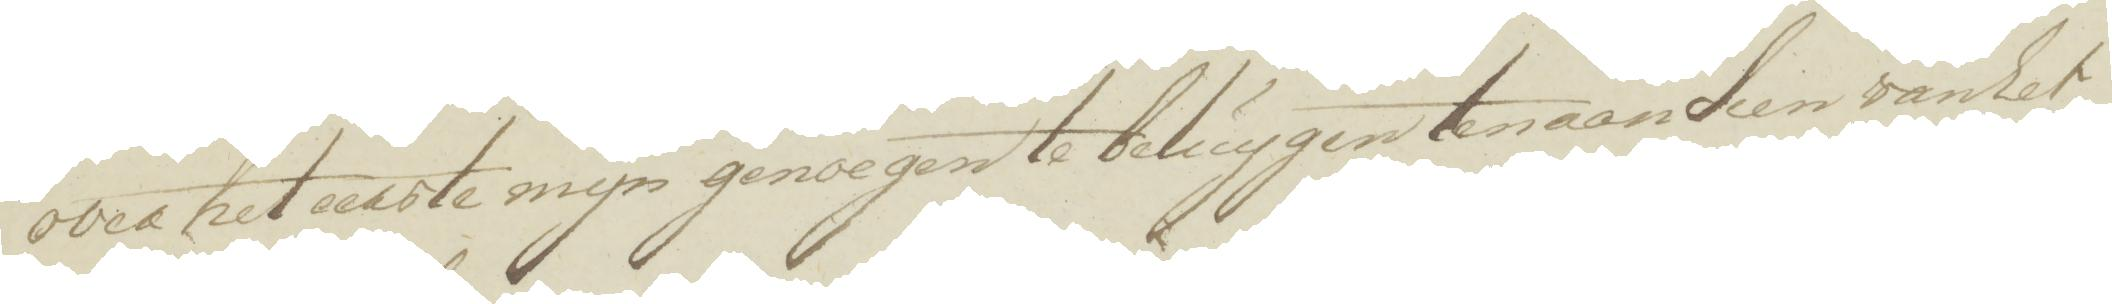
over het eerste mijn genoegen te betuygen ten aansien van het
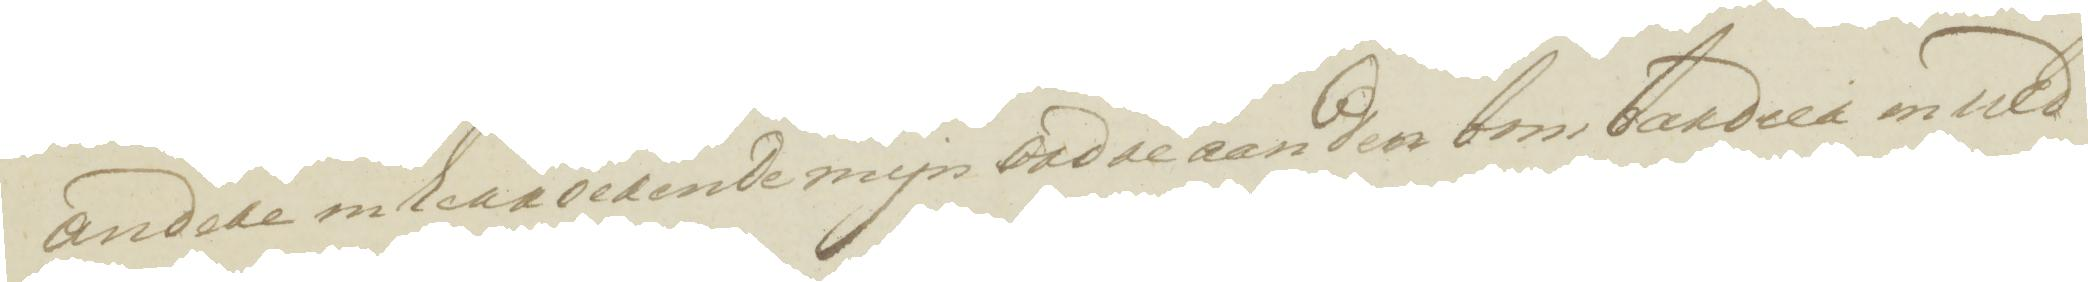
andere in herroerende mijn ordre aan den bombardier in uEd
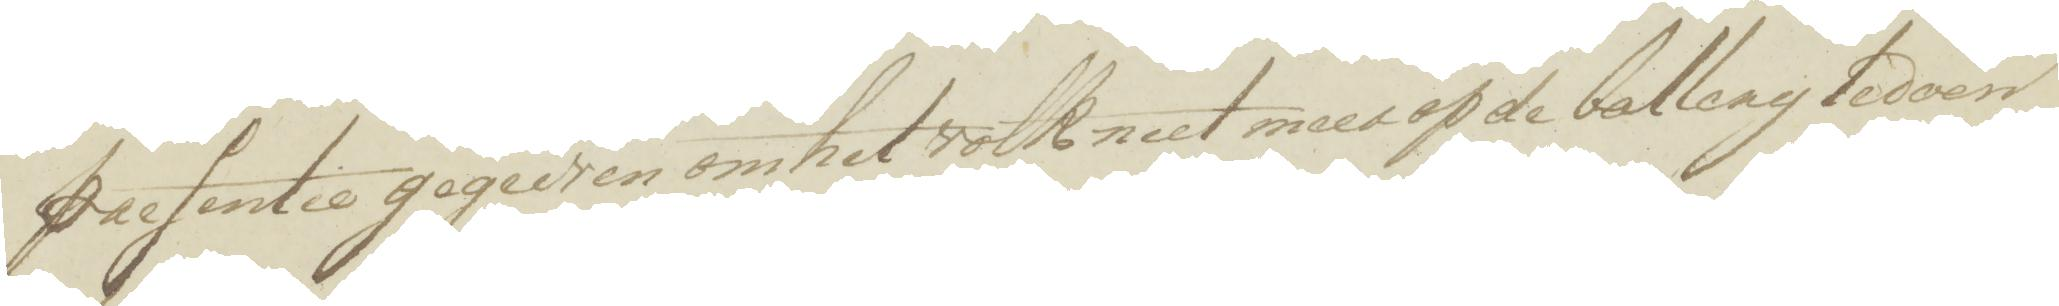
presentie gegeeven om het volk niet meer op de batterij te doen
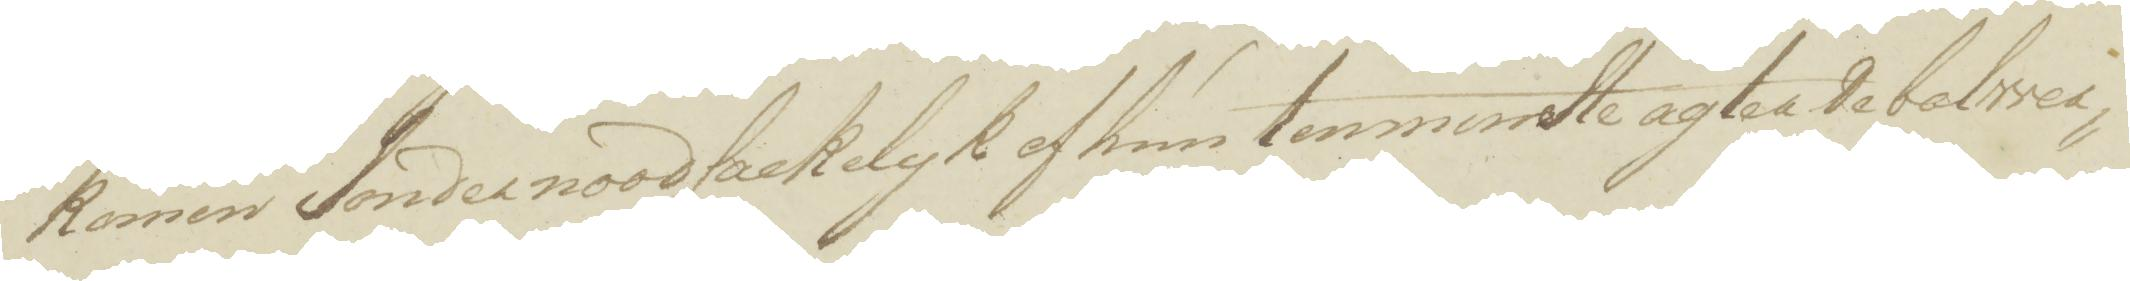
komen sonder noodsaekelyk of hun ten minste agter de bolwer„
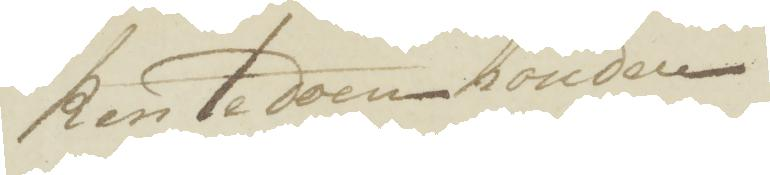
ken te doen houden
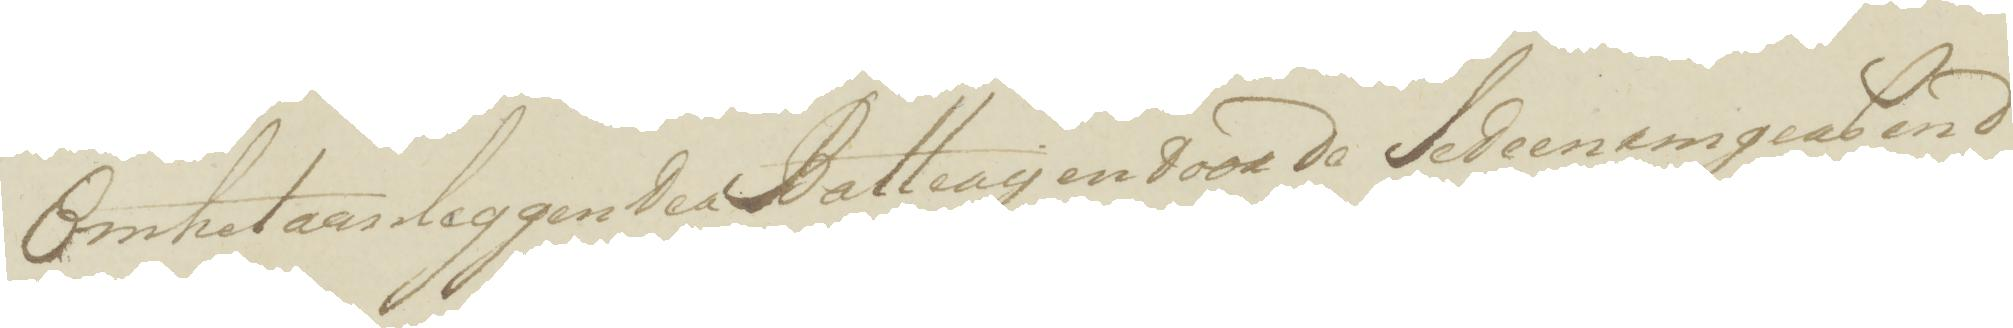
Om het aanleggen der Batterij en door de sedeenamgers en d
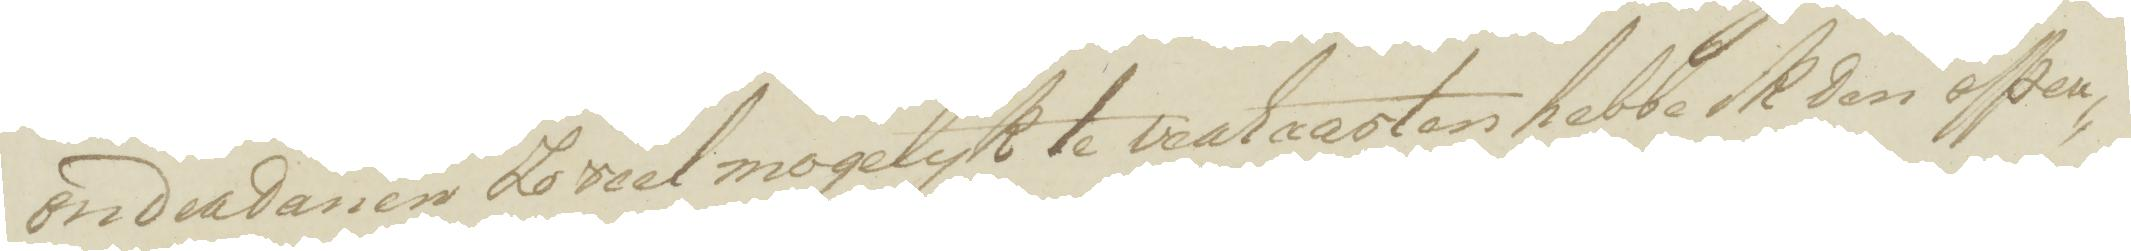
onderdanen zo veel mogelijk te verhaasten hebbe ik den opper„
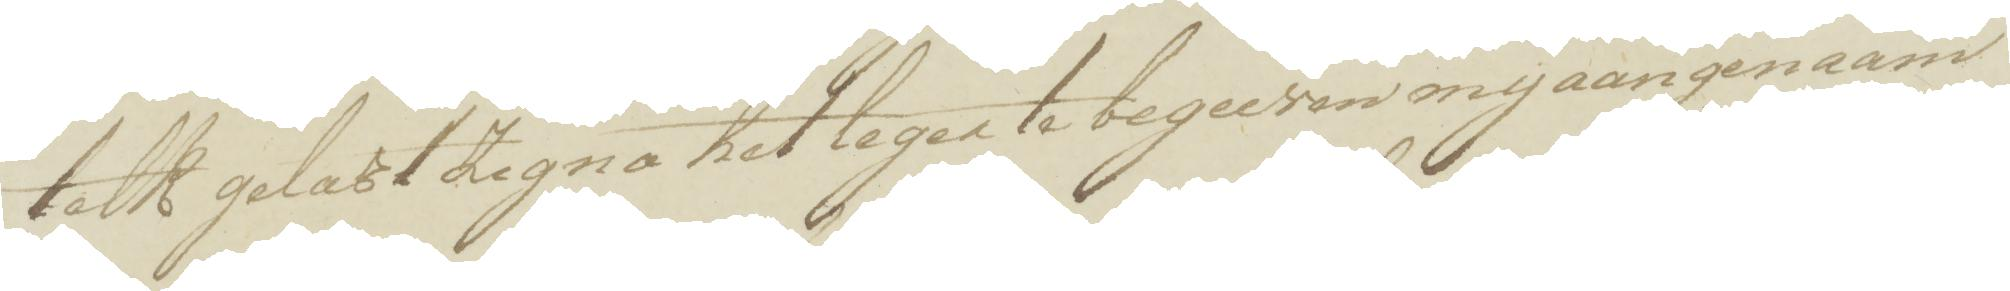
tolk gelast zig na het leger te begeeven mij aangenaam
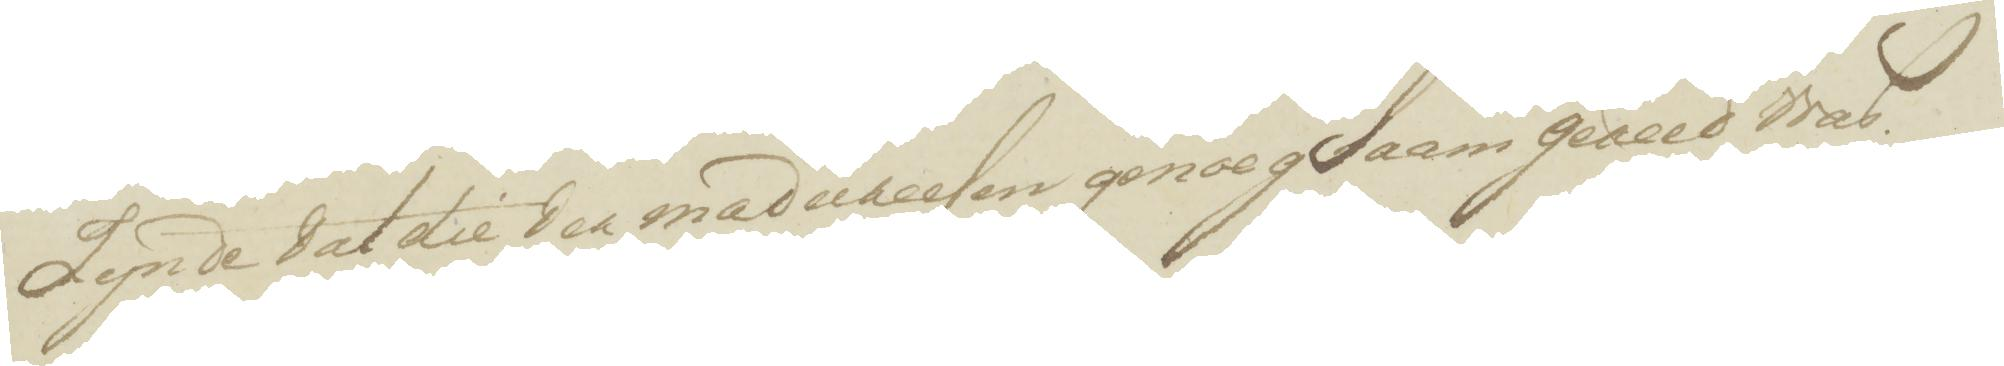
zynde dat die der madureesen genoegsaam gereed was.
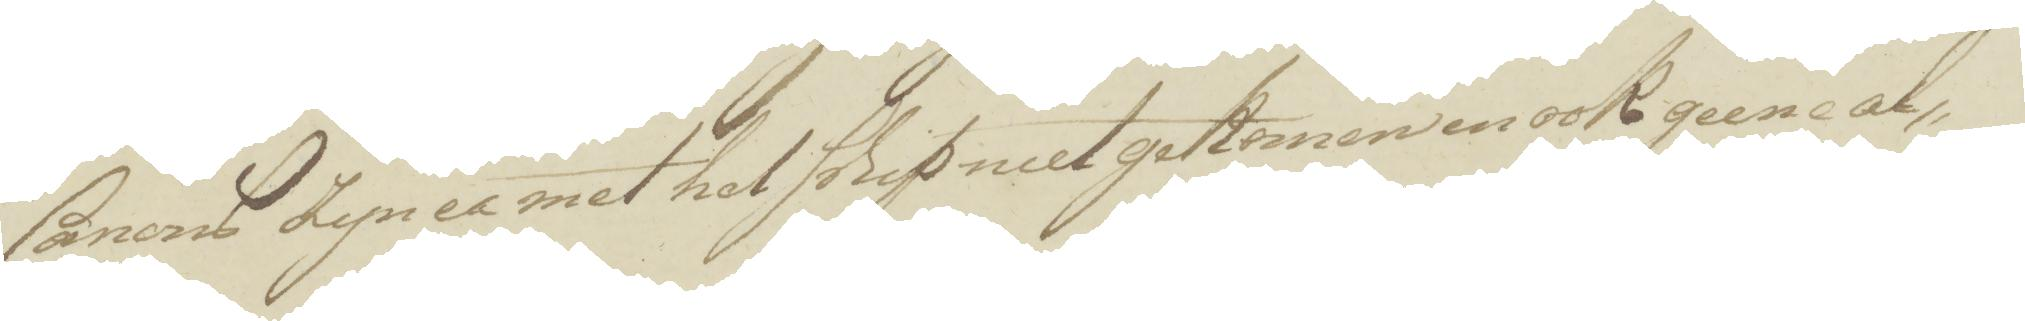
Canons zyn er met het schip niet gekomen en ook geene al„
